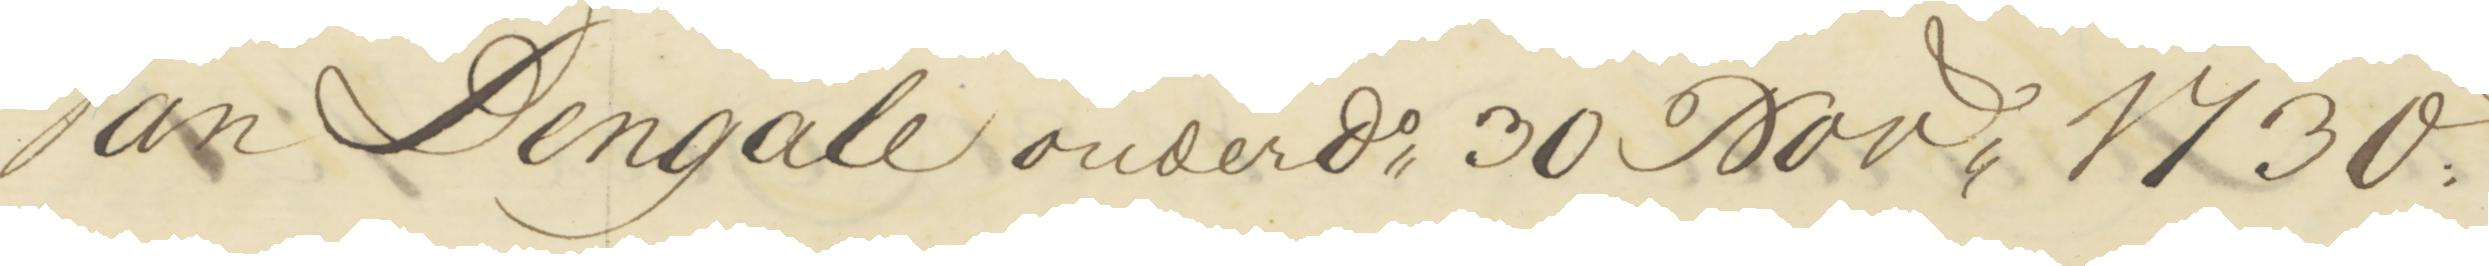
Van Bengale onder d„o 30 Nov„ 1730:
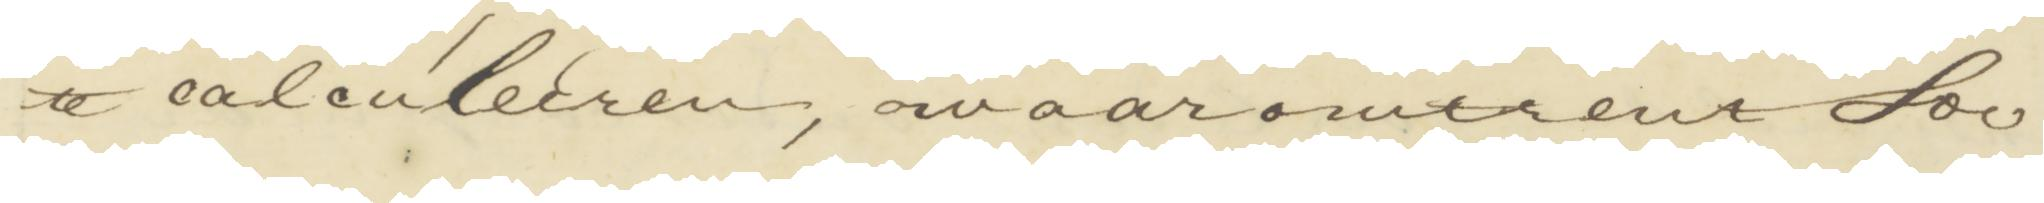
te calculeeren, waar omtrent soo
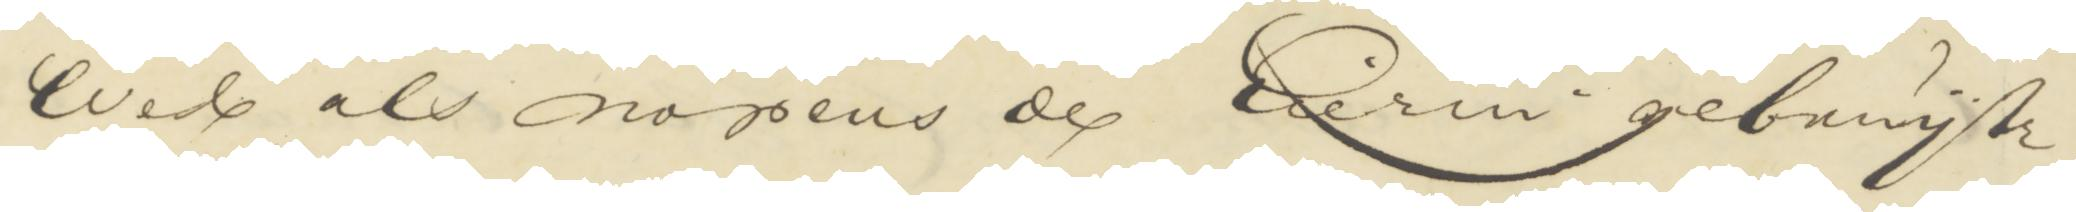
veel als nopens de hierin gebruijk
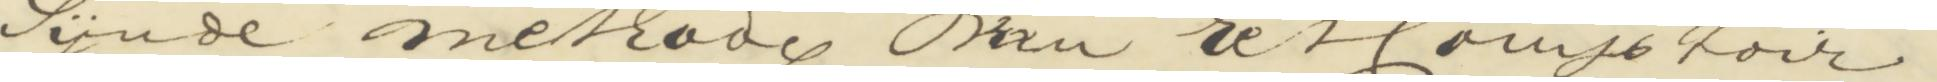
sijnde methode van het Comptoir
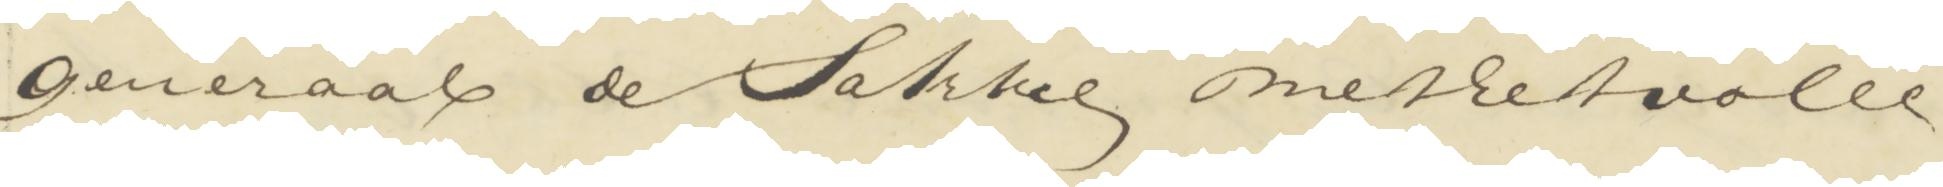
generaal de Sakken met het volle
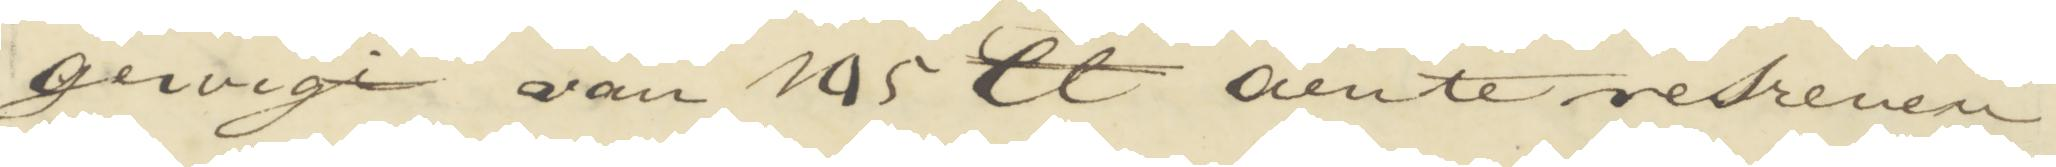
gewigt van 145 ll aen te rekenen
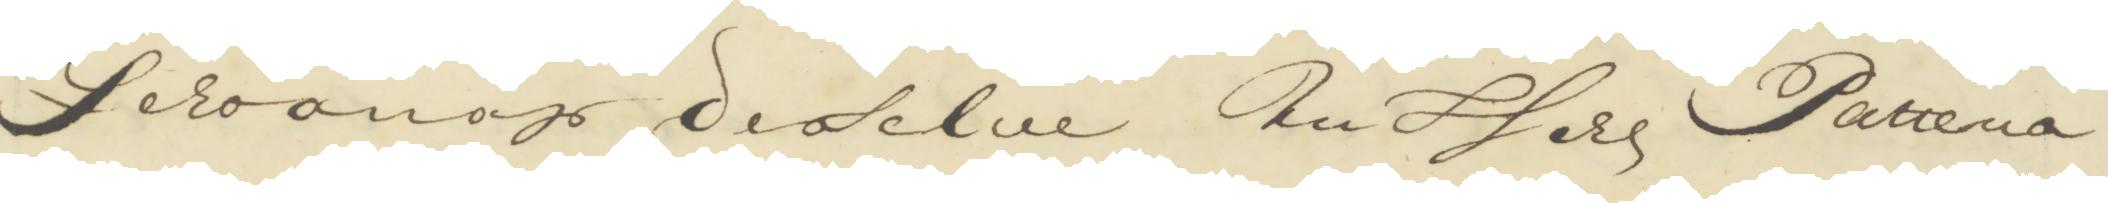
schoon op deselve tusschen Pattena
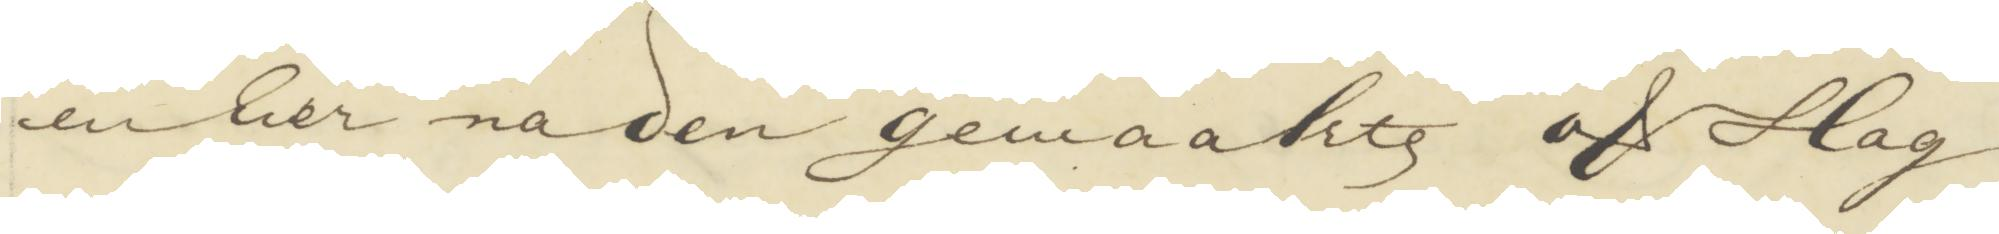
en hier na den gemaakten overslag
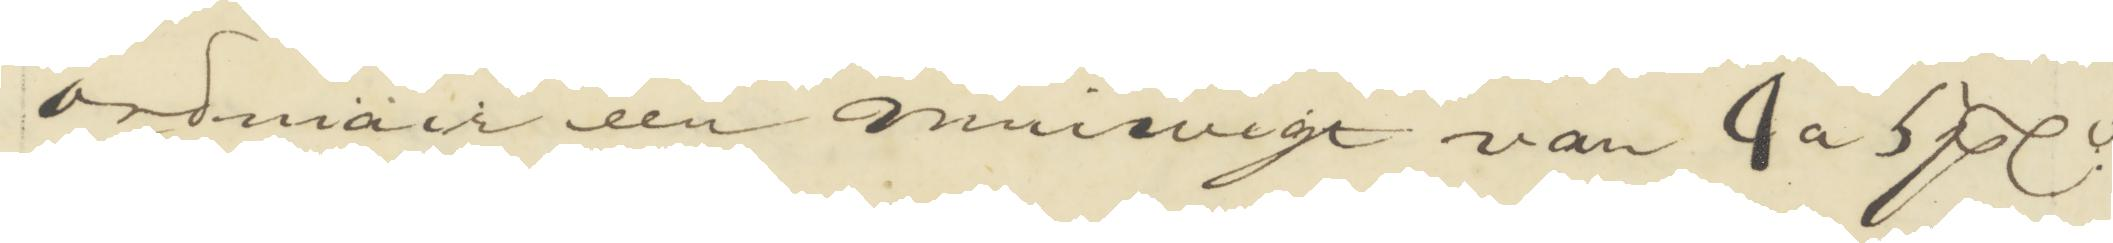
ordinair een minwigt van 4 a 5 pC
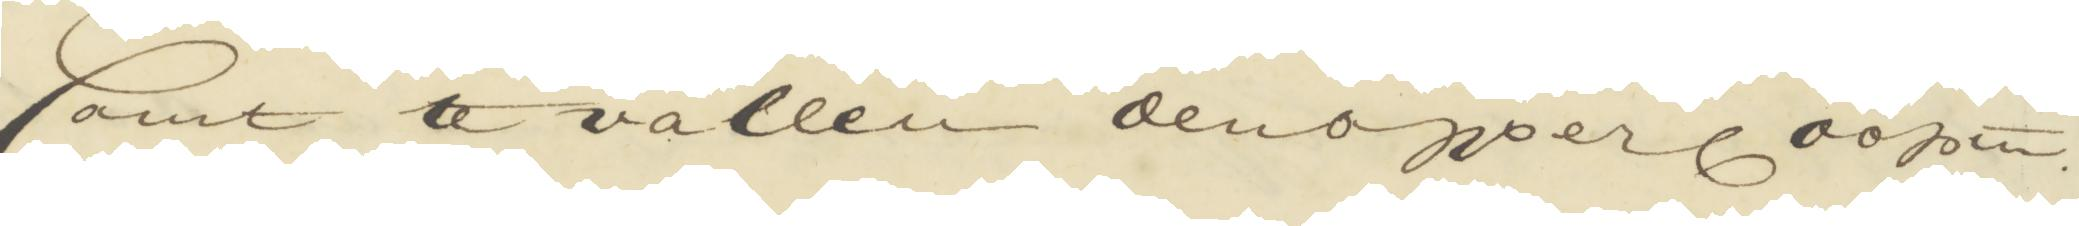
Comt te vallen den oppercoopm.
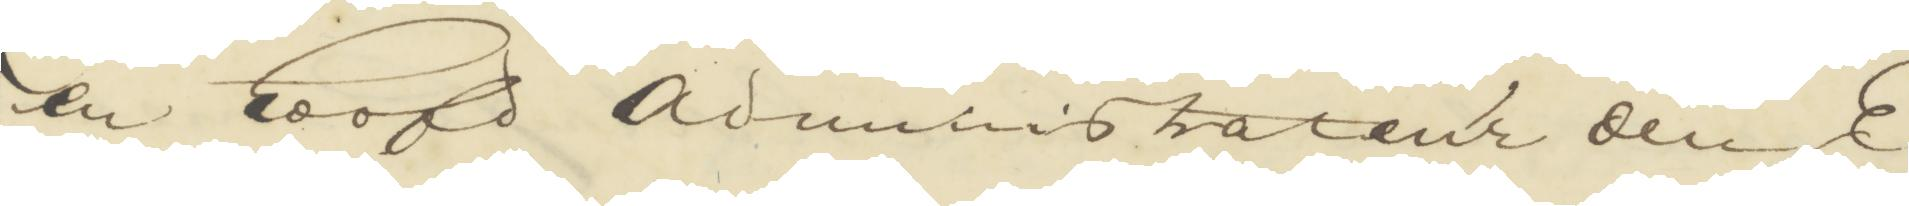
en hoofd Administrateur den E:l
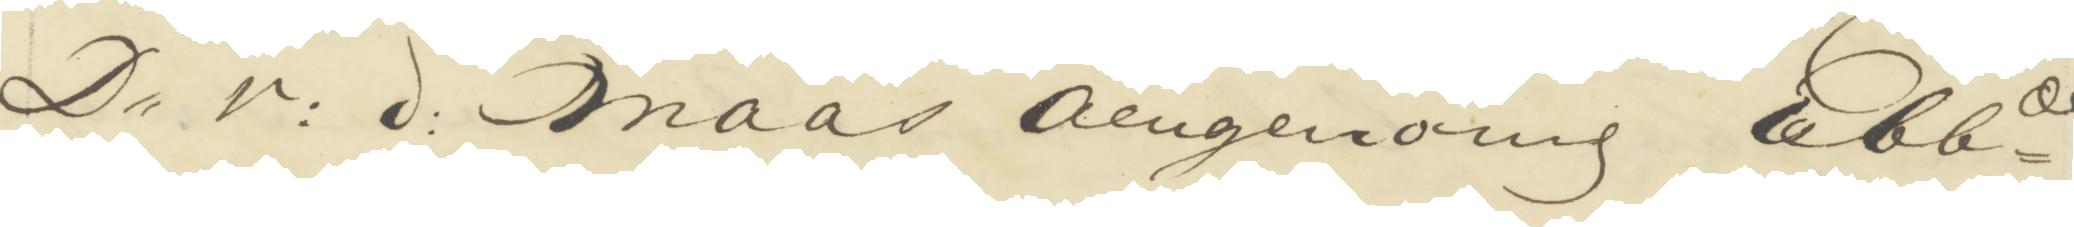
D„ v: d: Maas aengenomen Hebb=de
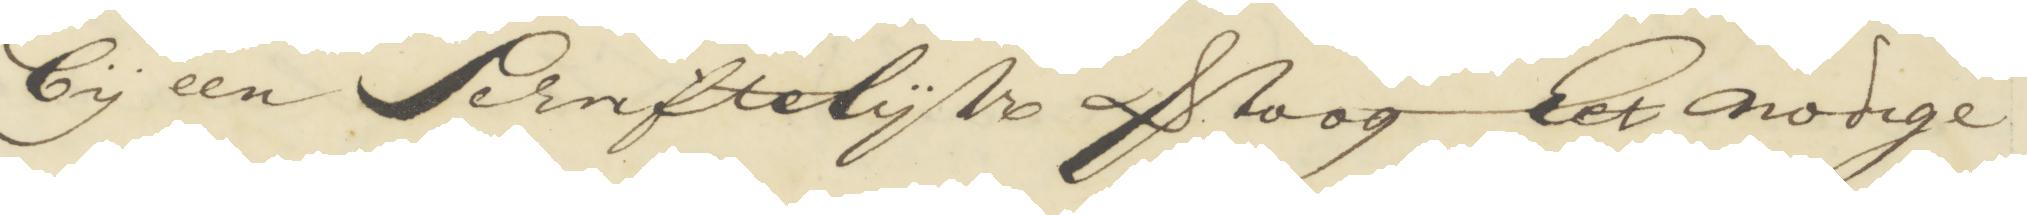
bij een schriftelijk vertoog het nodige
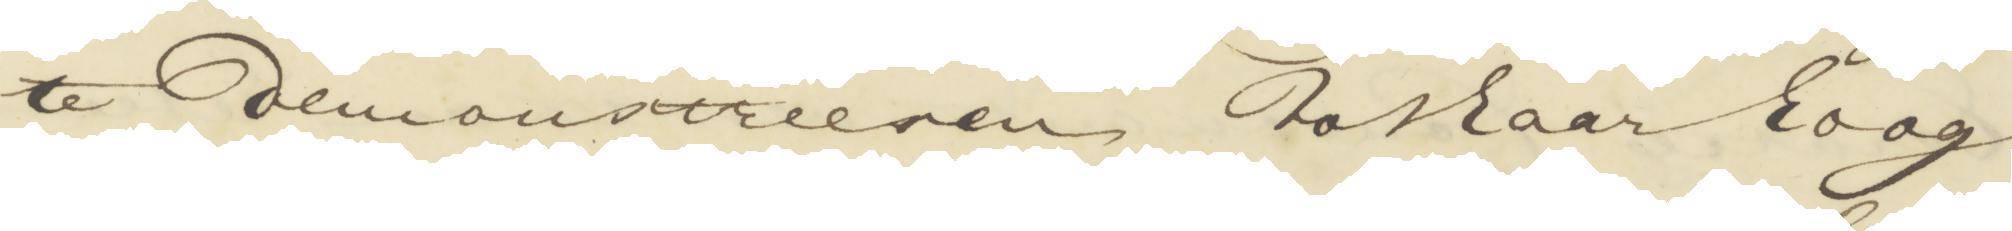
te demonstreeren tot haar hoog
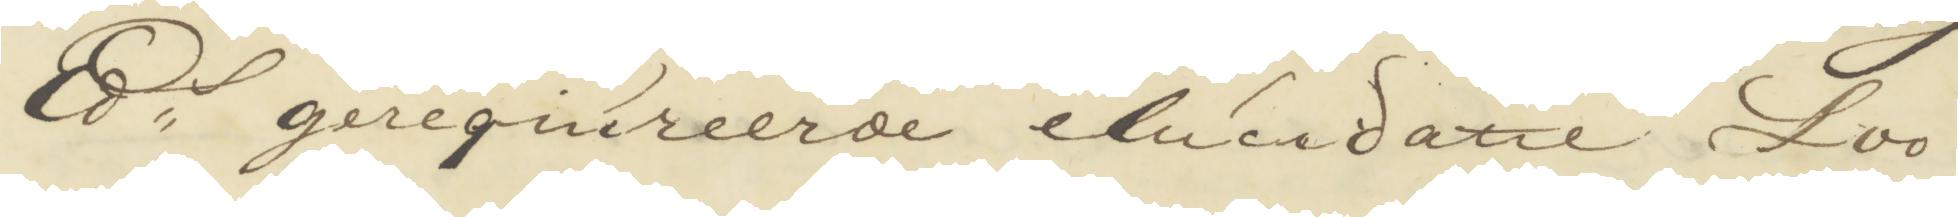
Ed„s gerequireerde elucidatie soo
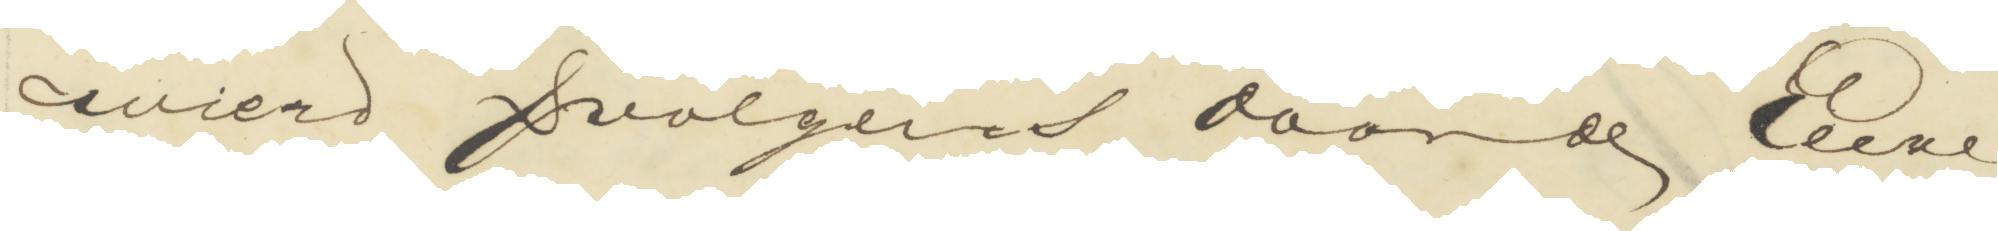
wierd vervolgens door den Heere
